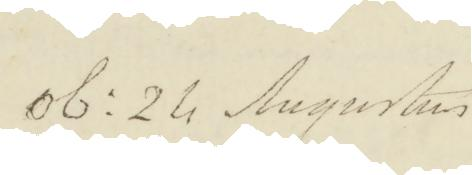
ob: 24 Augustus
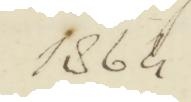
1864
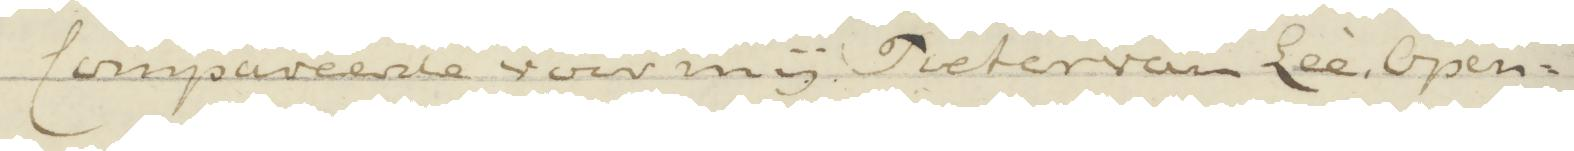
Compareerde voor mij Pieter van Leè, open=
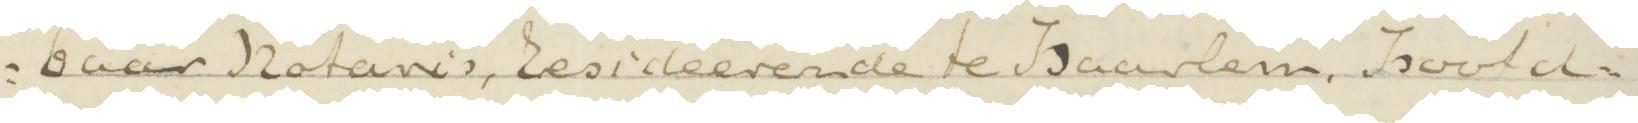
=baar Notaris, resideerende te Haarlem, Hoofd=
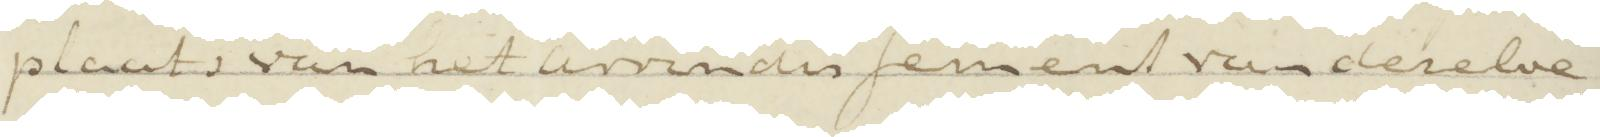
plaats van het arrondissement van dezelve
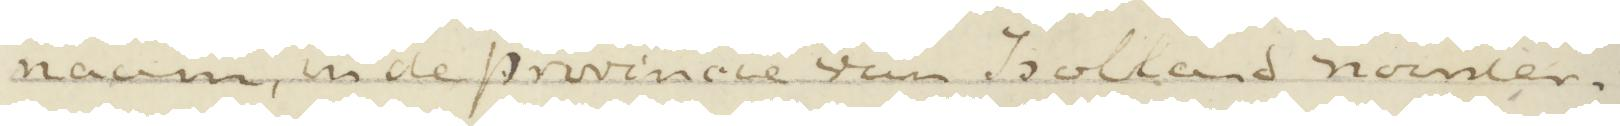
naam, in de provincie van Holland noorder,
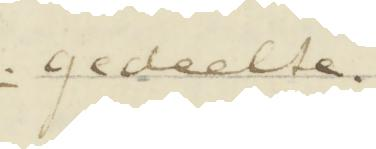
=gedeelte.
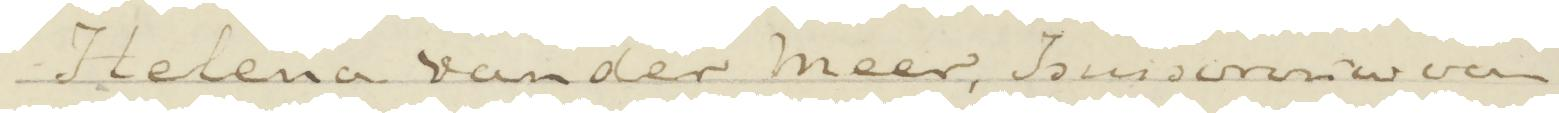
Helena van der meer, Huisvrouw van
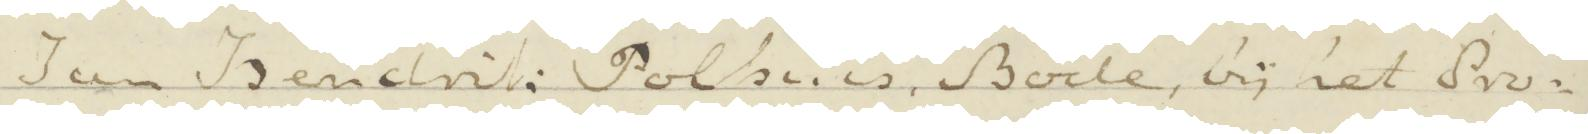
Jan Hendrik Polhuis, Bode, bij het Pro=
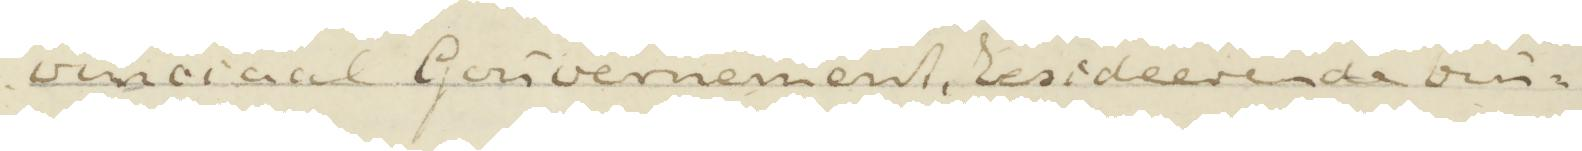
vinciaal Gouvernement, resideerende bin=
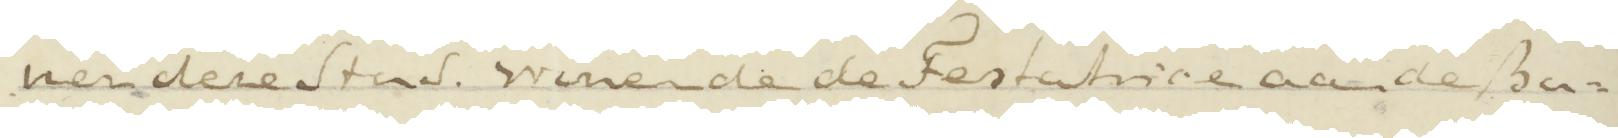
nen deze stad. wonende de Testatrice aan de Ba=
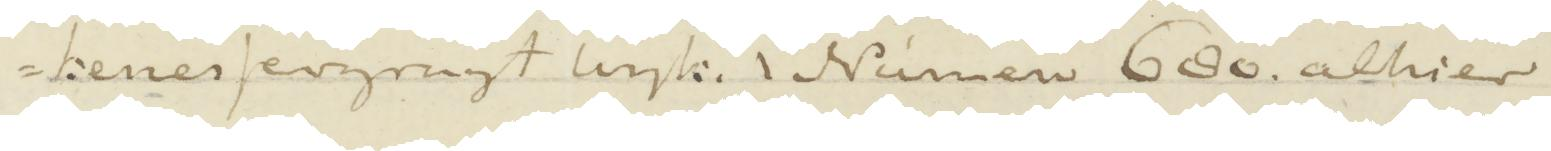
=kenessergragt wyk. 1 Numero 680. alhier
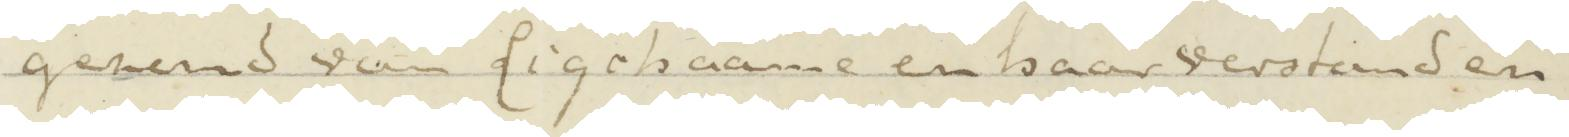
gezond van Ligchaame en haar verstand en
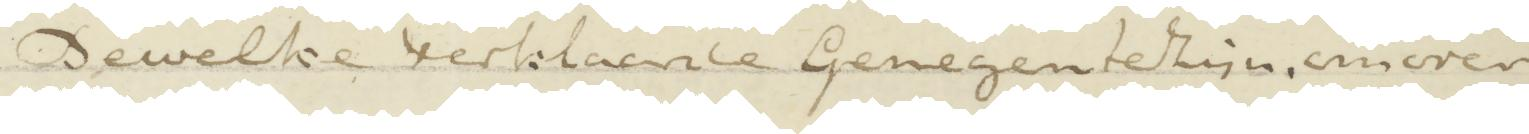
Dewelke verklaarde Genegen te zijn, om over
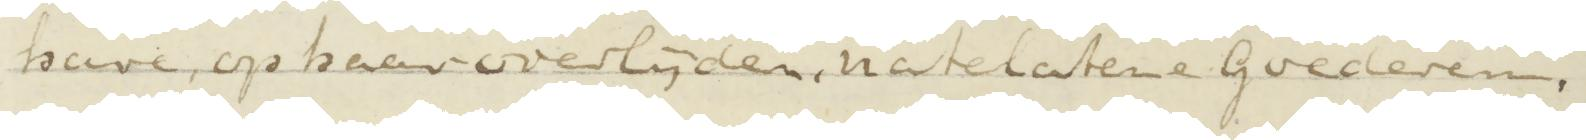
hare, op haar overlijden, natelatene Goederen,
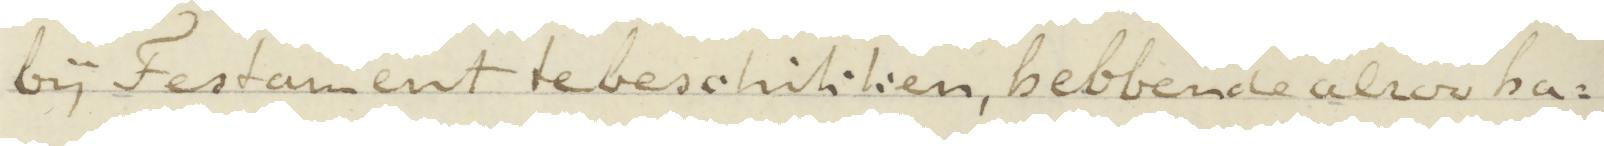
bij Testament te beschikken, hebbende alzoo ha=
